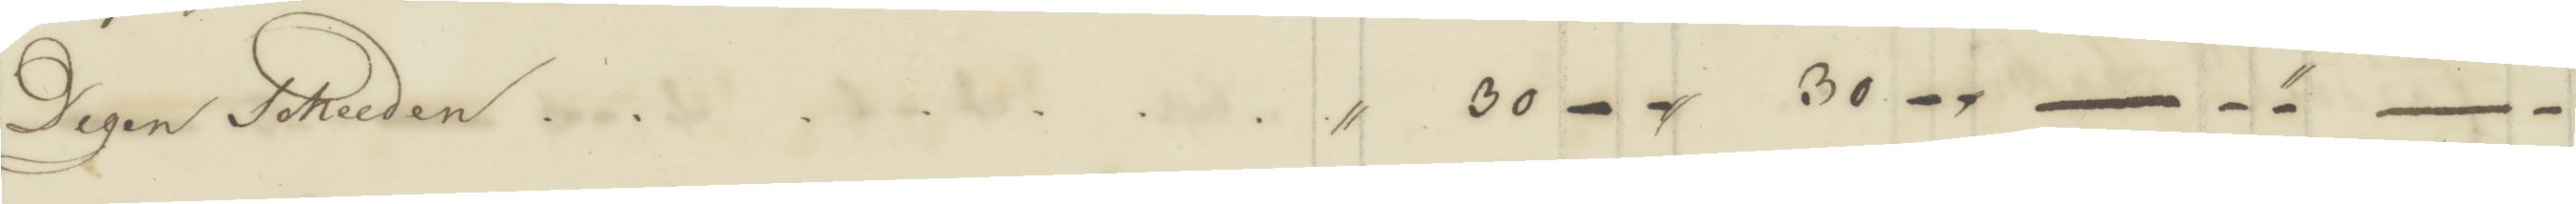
Degen scheeden „ 30 – –„ 30 – –
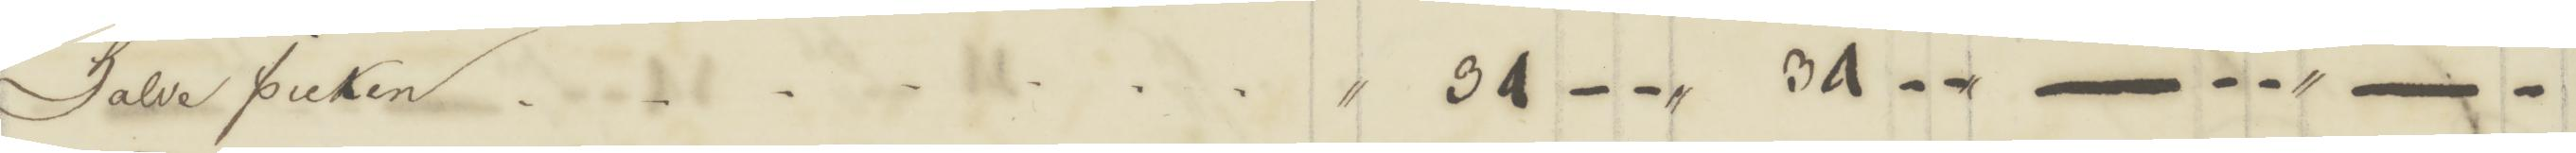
Halve pieken „ 34 – –„ 34 – –„ — – –„ — -
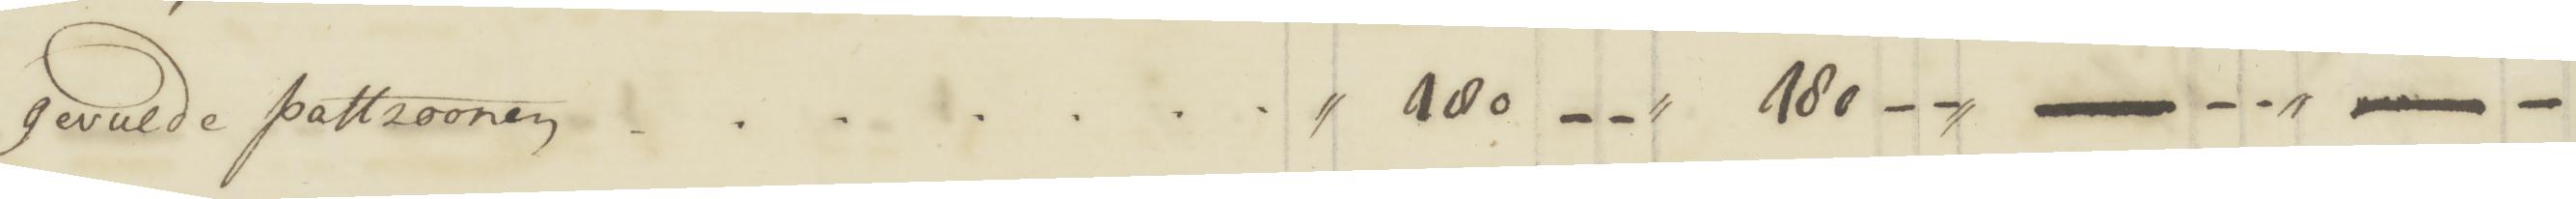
gevulde pattroonen „ 480 – –„ 480 – –„ — – –„ — -
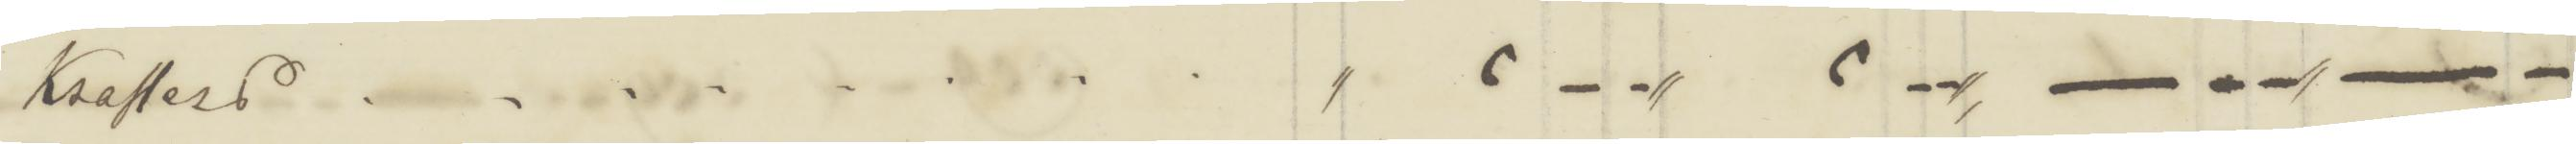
Krasters „ 5 – –„ 5 – –„ — – –„— –
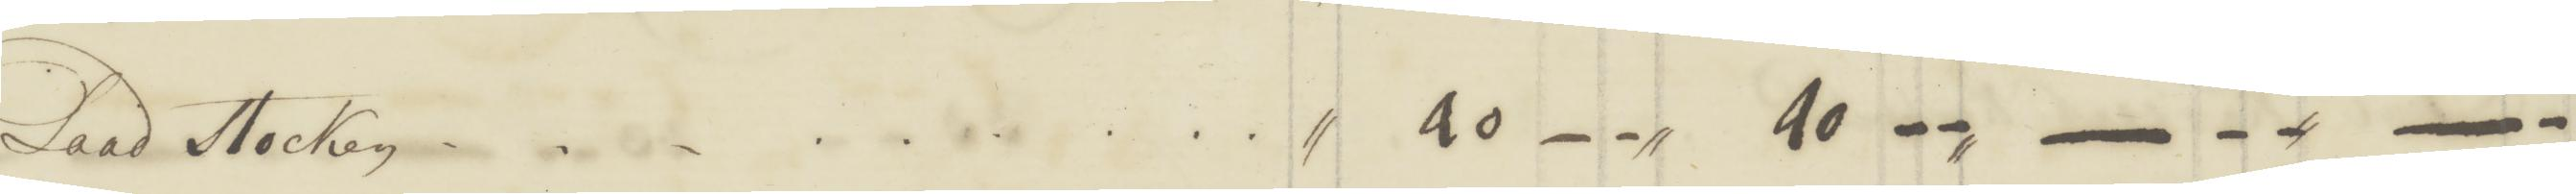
Laad stocken „ 40 – –„ 40 – –„ — – –„— –
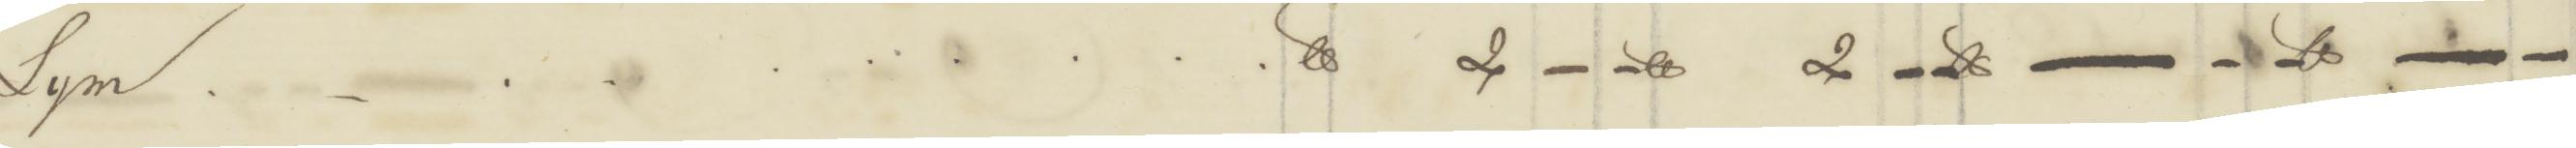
Lym lb 2 – –lb 2 – –lb 2 — – –lb — –
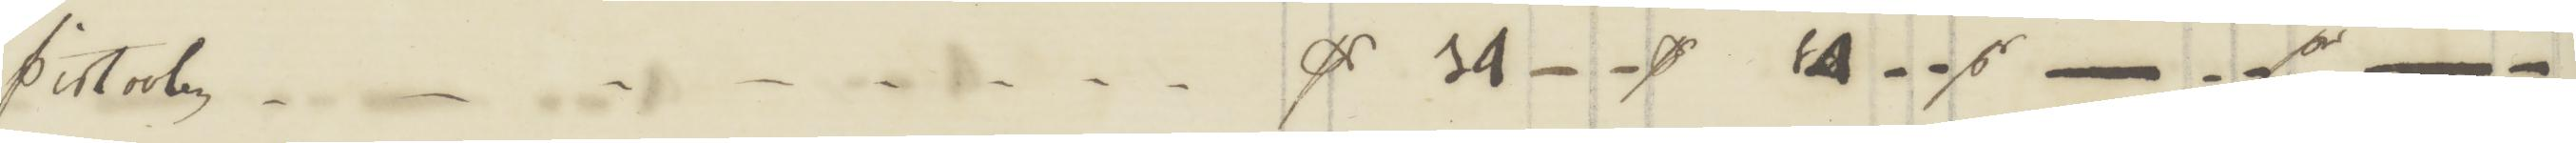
pistoolen pr 14 – –pr 14 – –ps — – –pr — –
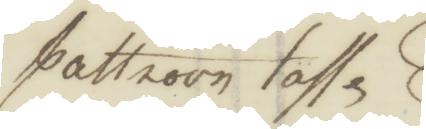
pattroon tassen
